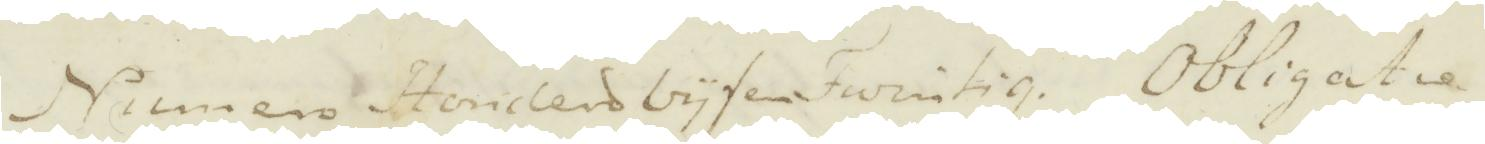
Numero Honderd Vijf en Twintig. Obligatie.
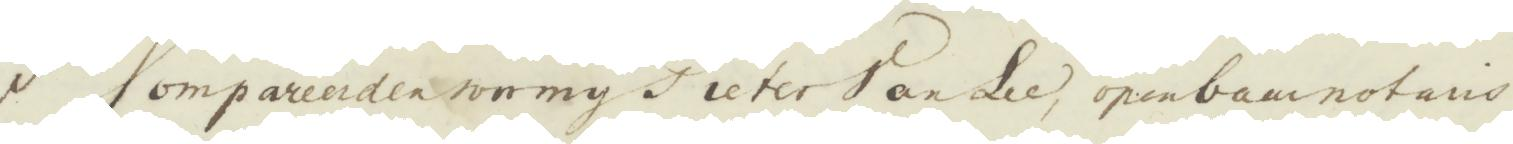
Compareerden voor my Pieter Van Lee, openbaar notaris
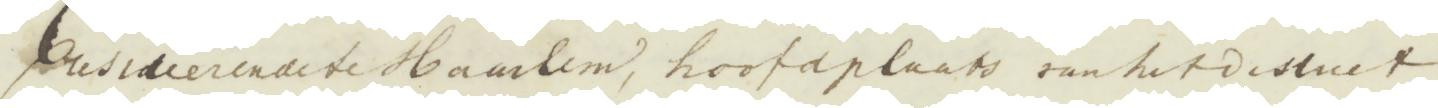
resideerende te Haarlem, hoofdplaats van het district
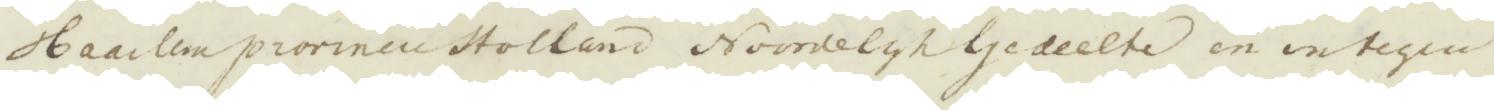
Haarlem provincie Holland Noordelyk Gedeelte en in tegen
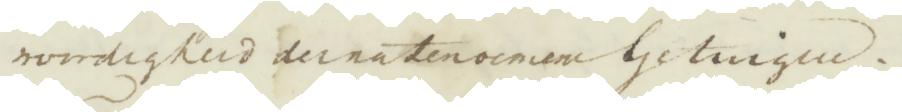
woordigheid der natenoemen Getuigen.
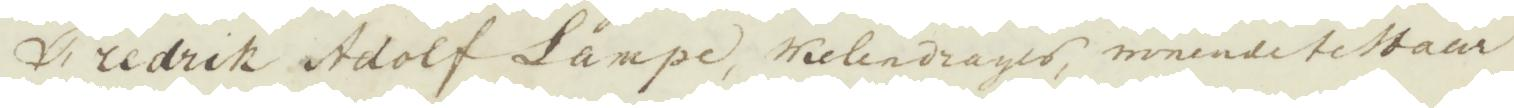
Frederik Adolf Lampe, wielendrager wonende te Haar
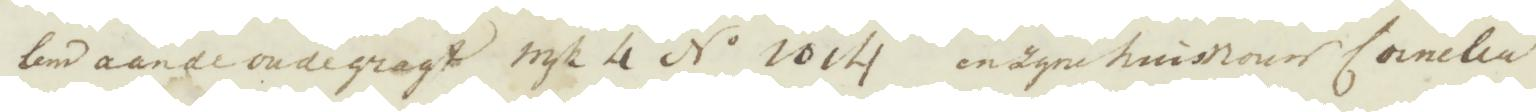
lem aan de oude gragt wyk 4 No 1014 en zyne huisvrouw Cornelia
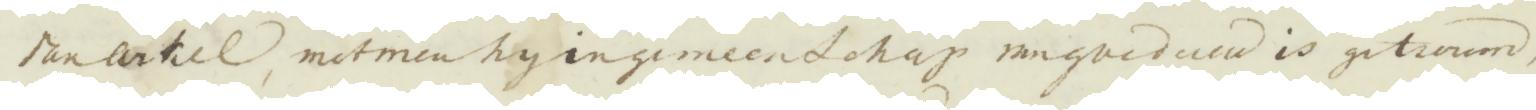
van arkel, met wie hy in gemeenschap van goederen is getrouwd
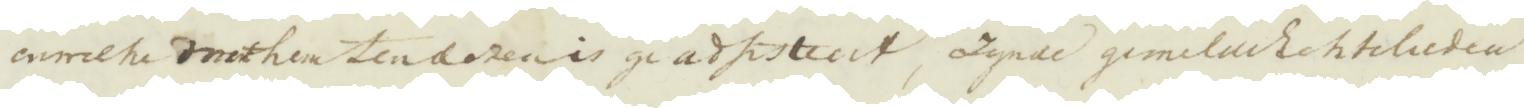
en welke met hem ten dezen is geadsisteert, zynde gemelde Echtelieden
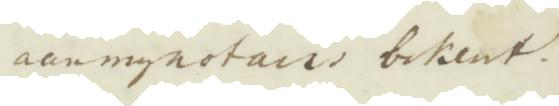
aan my notaris bekent.
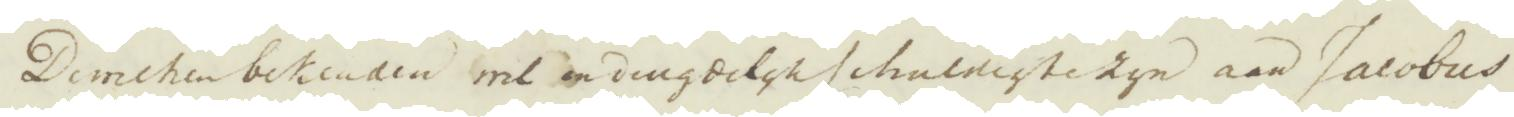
Dewelken bekenden mt en deugdelyk schuldig te zyn aan Jacobus
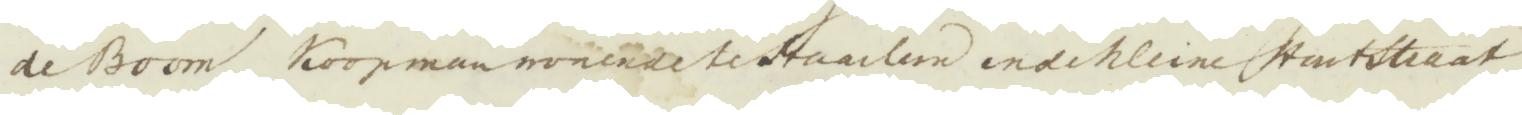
de Boom, koopman wonende te Haarlem in de Kleine Houtstraat
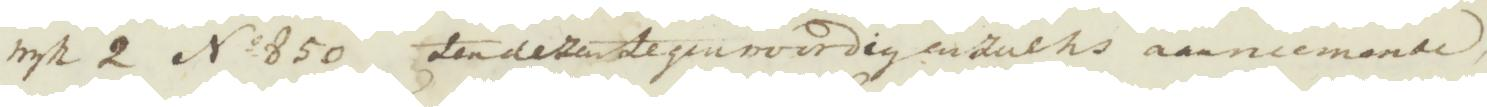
wyk 2 N=o 850 ten dezen tegenwoordig en zulks aanneemende
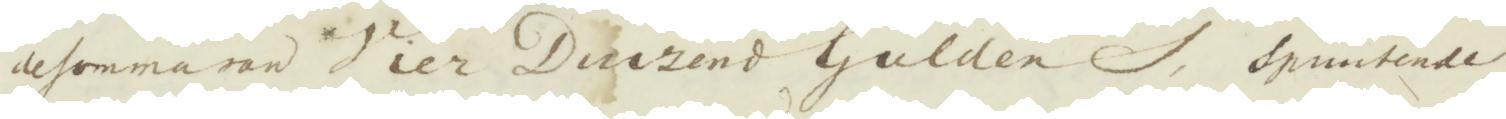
de somma van Vier Duizend Guldens, spuntende
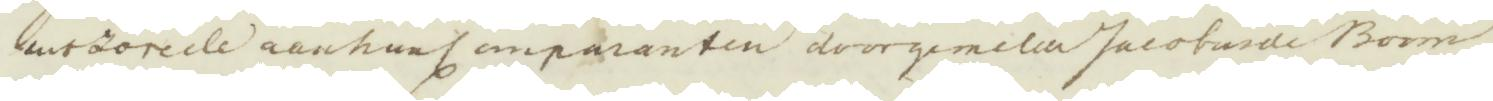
uit zoveele aan hun Comparanten door gemelde Jacobus de Boom
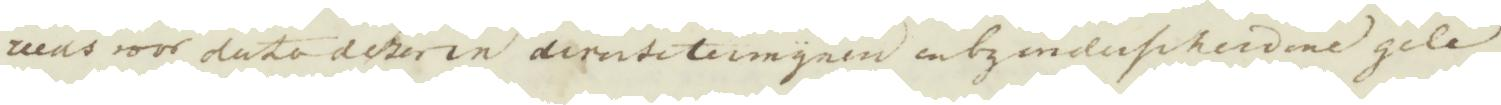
reeds voor dato dezer in diverse termijnen en by onderscheidene gele
